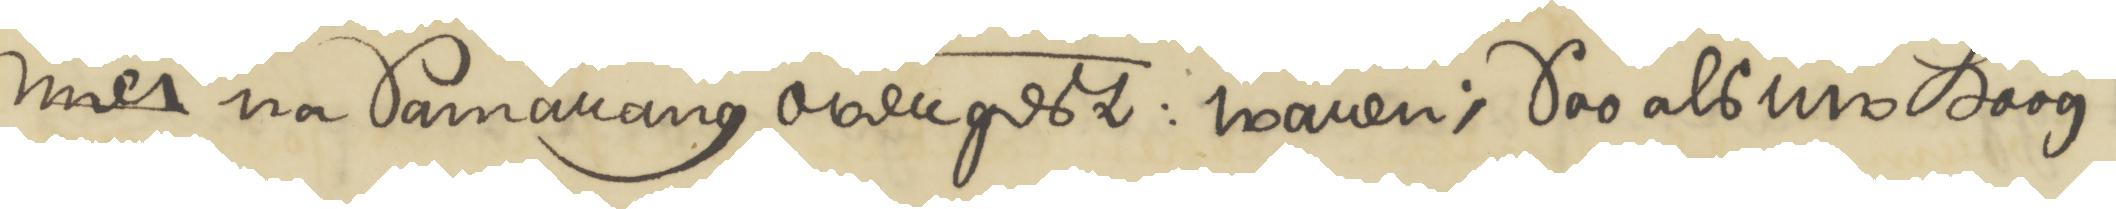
niet na samarang overgesz: waren; soo als uw Hoog
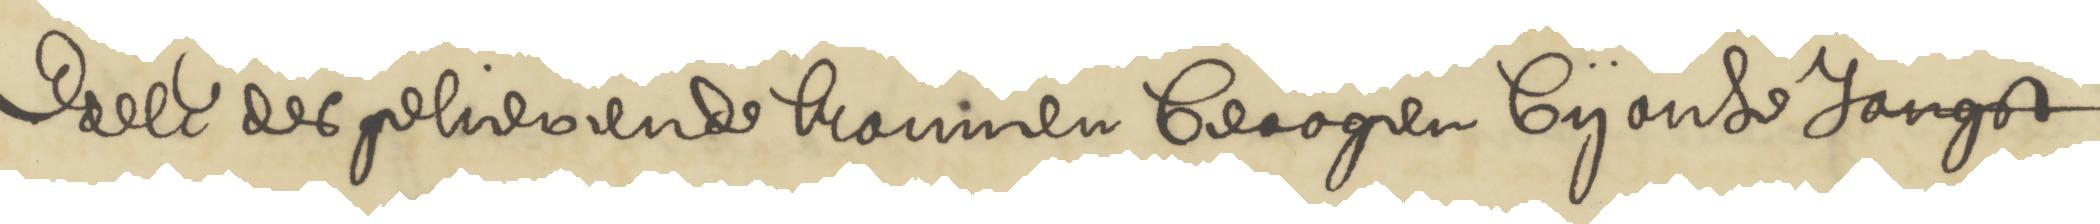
Edele des gelievende konnen beoogen bij onse Jongst
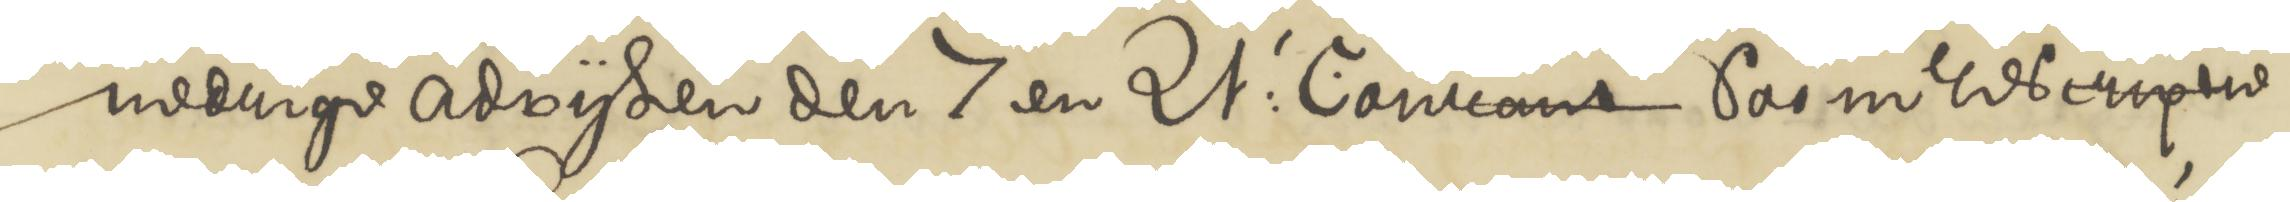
nedrige advijsen den 7 en 21:' Courant soo in rescriptie
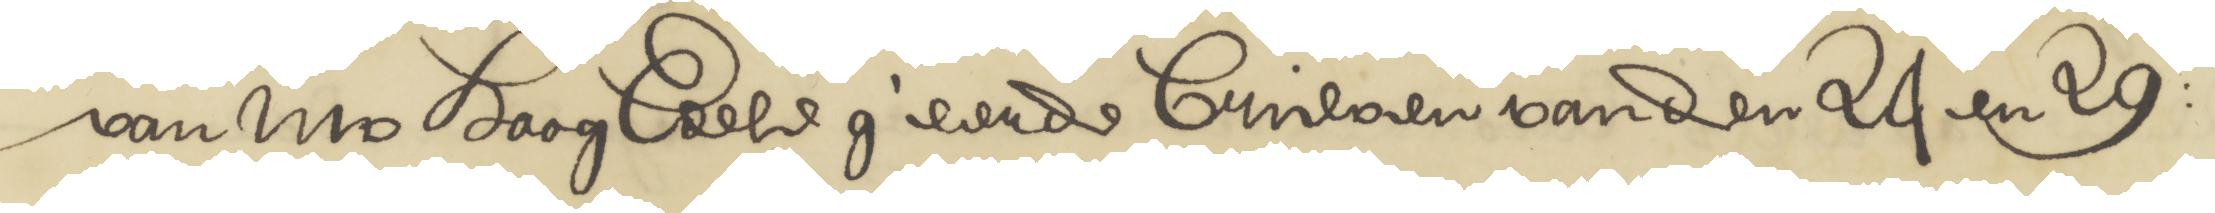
van Uw Hoog Edele g’eerde brieven van den 24 en 29:'
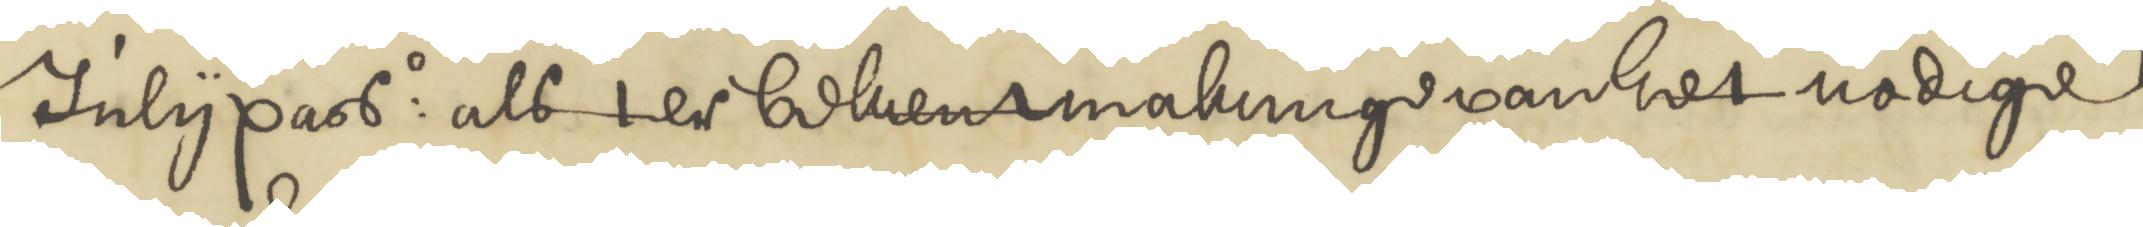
Julij pass:o als ter bekentmakinge van het nodige
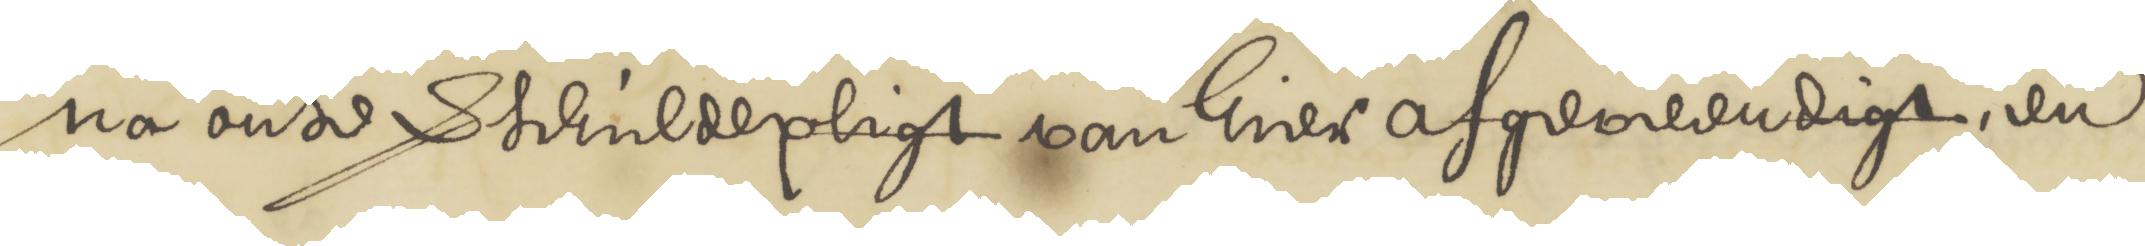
na onse verschuldepligt van hier afgeveerdigt, en
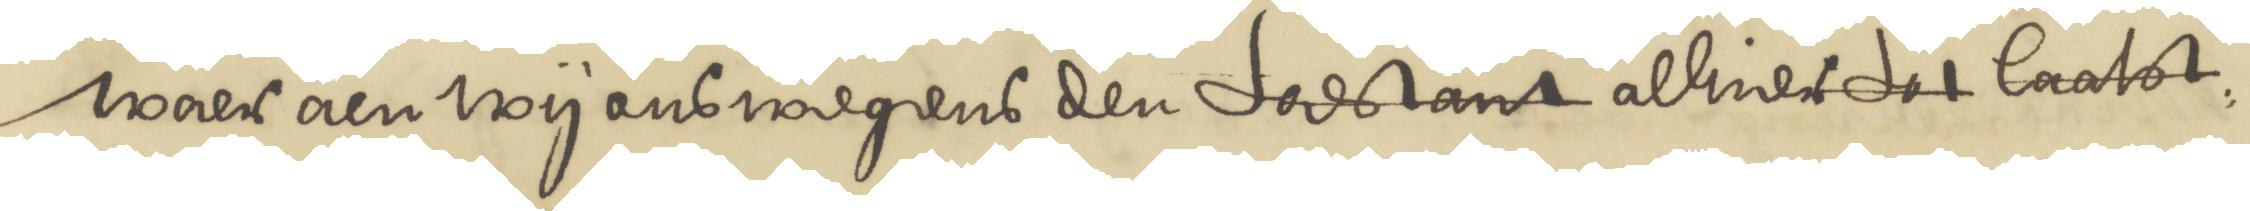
waer aen wij ons wegens den toestant alhier tot laatst„
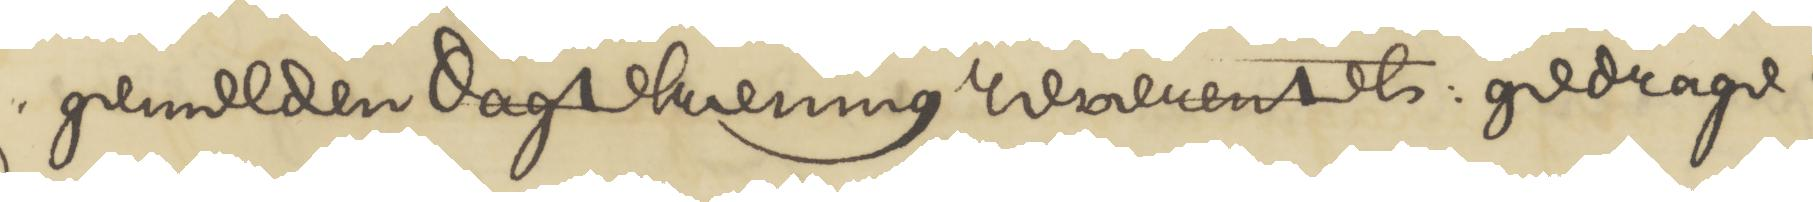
„gemelden dagtekening reverentelijk: gedrage
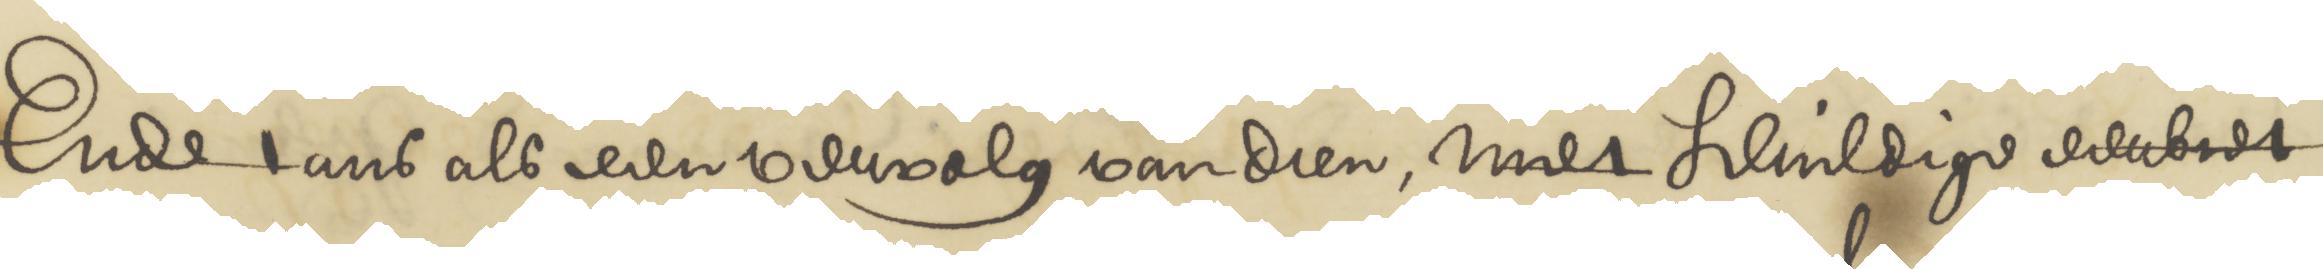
Ende tans als een vervolg van dien, met schuldige eerbiet
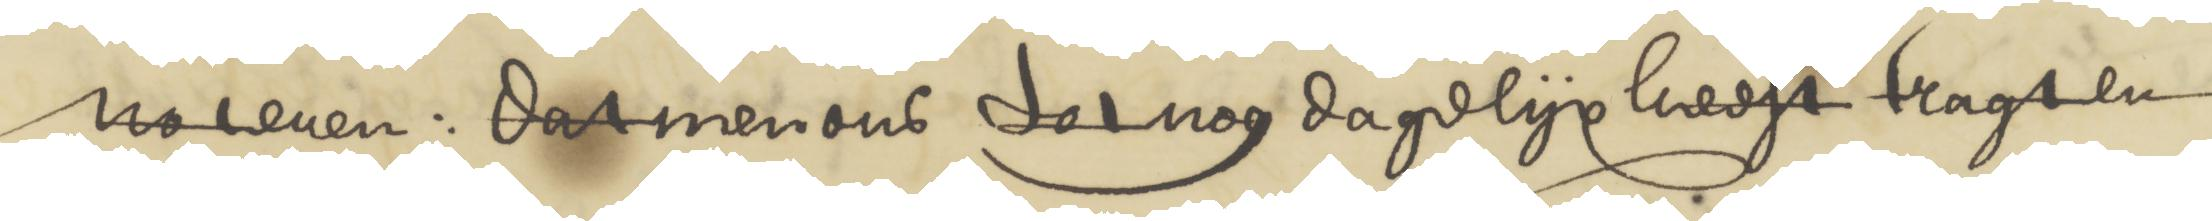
noteren: dat men ons tot nog dagelijx heeft tragten
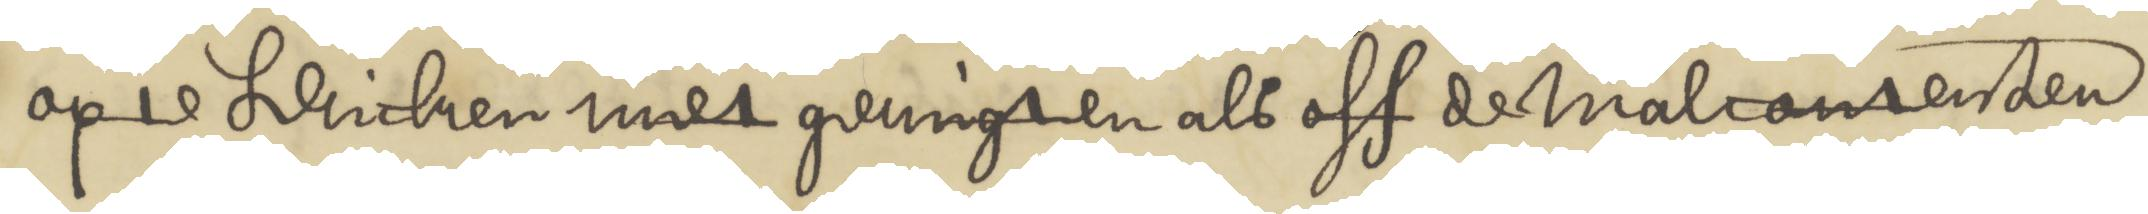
op te schicken met gerugten als off de malcantenten
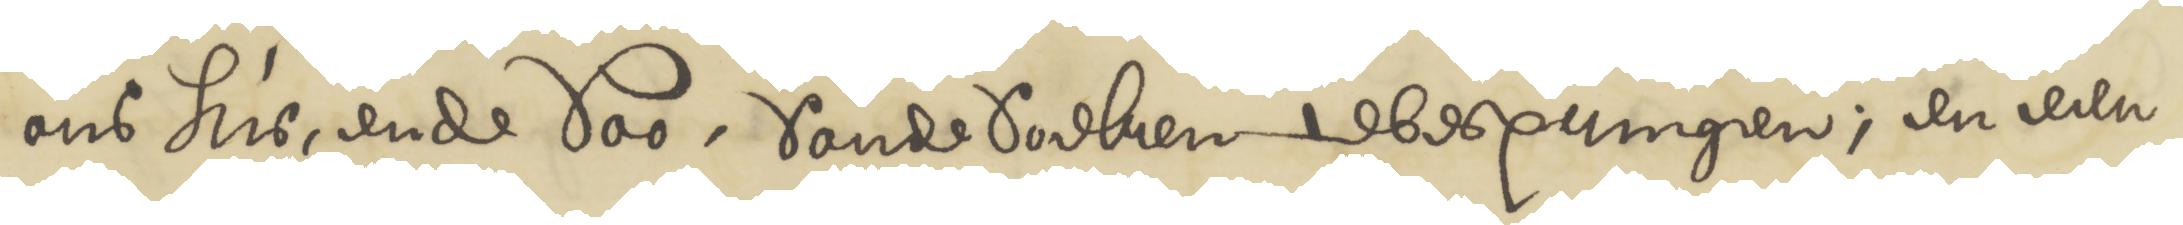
ons sus, ende soo, soude soeken te bespringen; en een
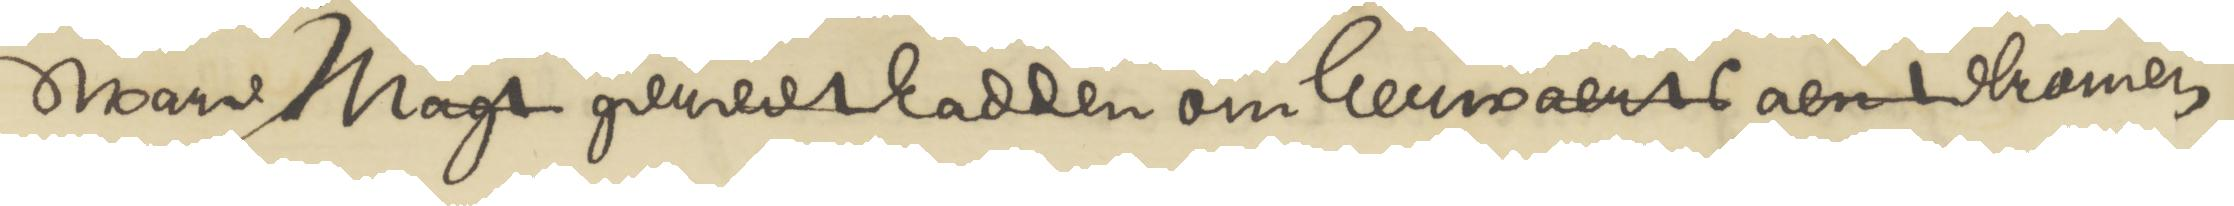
ware Magt gereet hadden om herwaerts aen te komen
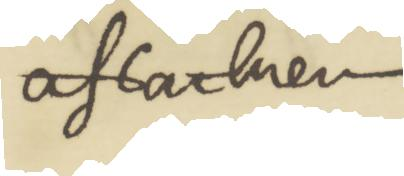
afsacken
